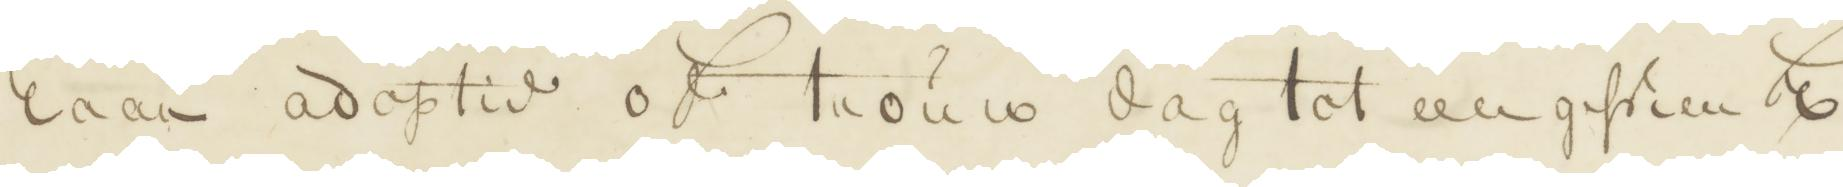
haar adoptie of trouw dag tot een geschenk
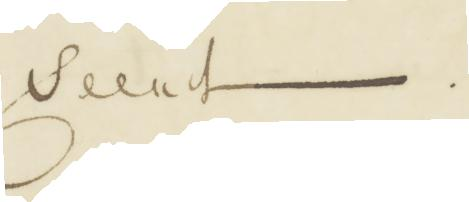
vereert.
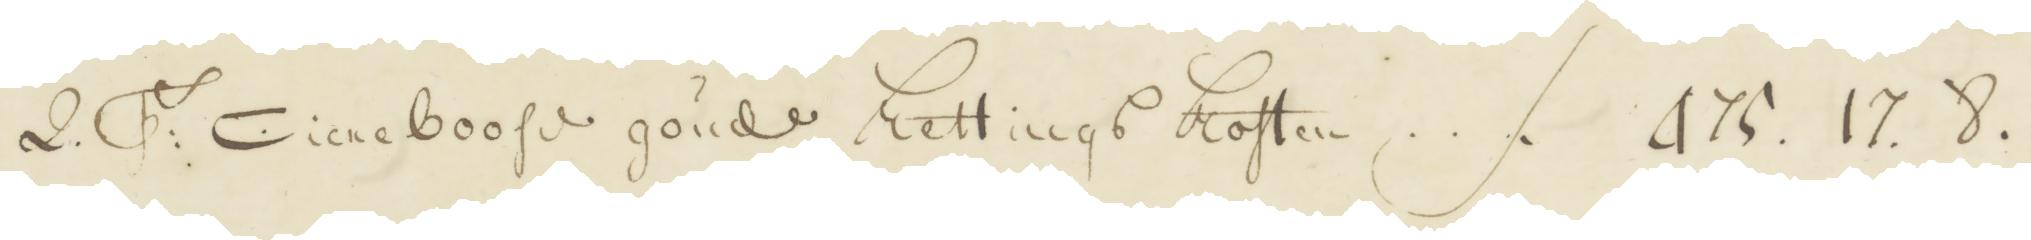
2. p:s cicreboose goude kettings kosten . . ƒ 475. 17. 8.
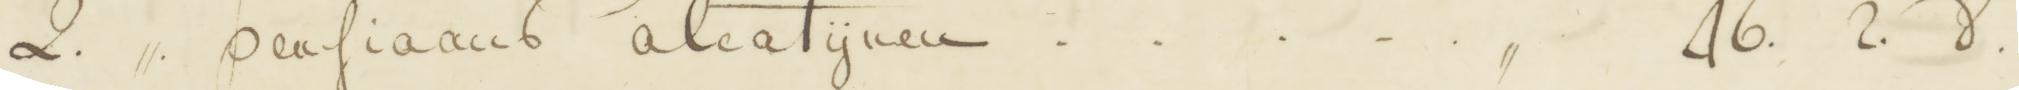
2. „. persiaans alcatijnen - - - - - „ 46. 2. 8.
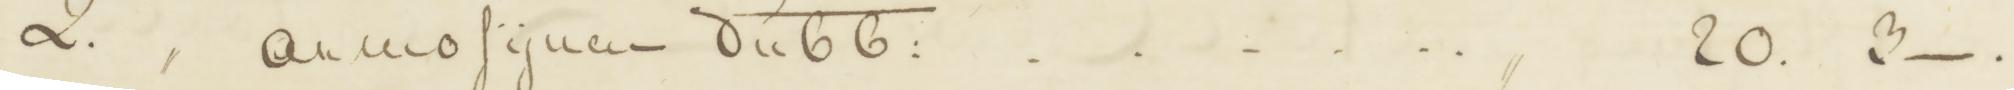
2. „ armosijnen dubb: - - - - - - 20. 3 —.
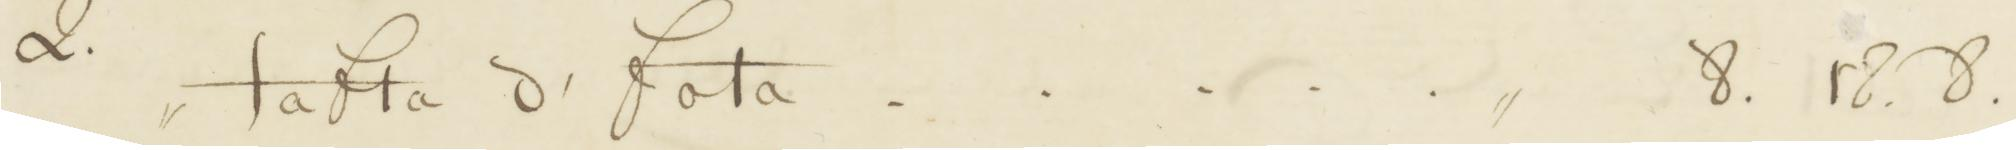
2. „ tafta d' fota - - - - - „ 8. 18. 8.
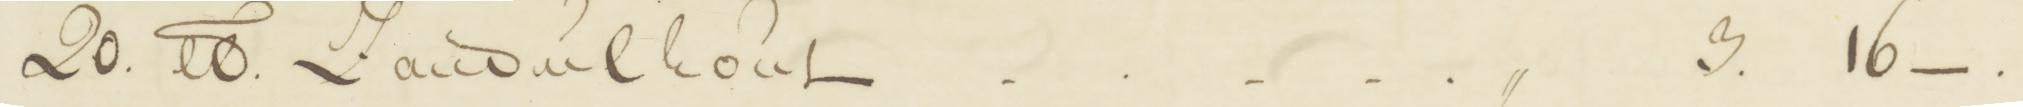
20. lb. zandulhout - - - - - „ 3. 16 —.
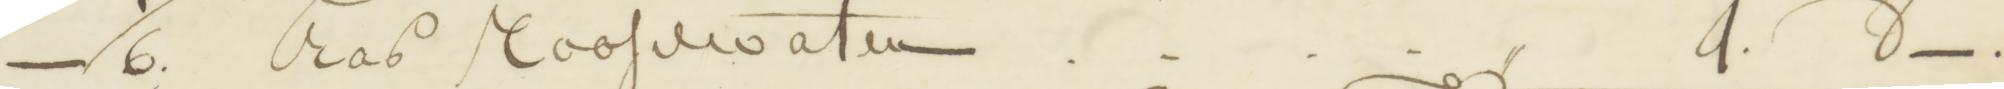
— 1/6. kas roosewater - - - - „ 4. 8 —.
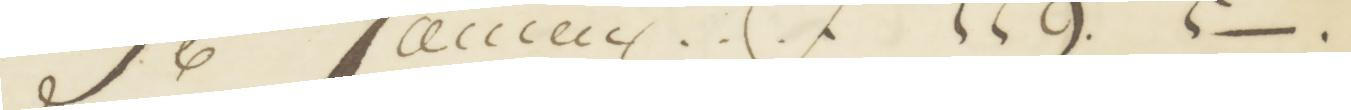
Is samen - - - ƒ 559. 5 —.
